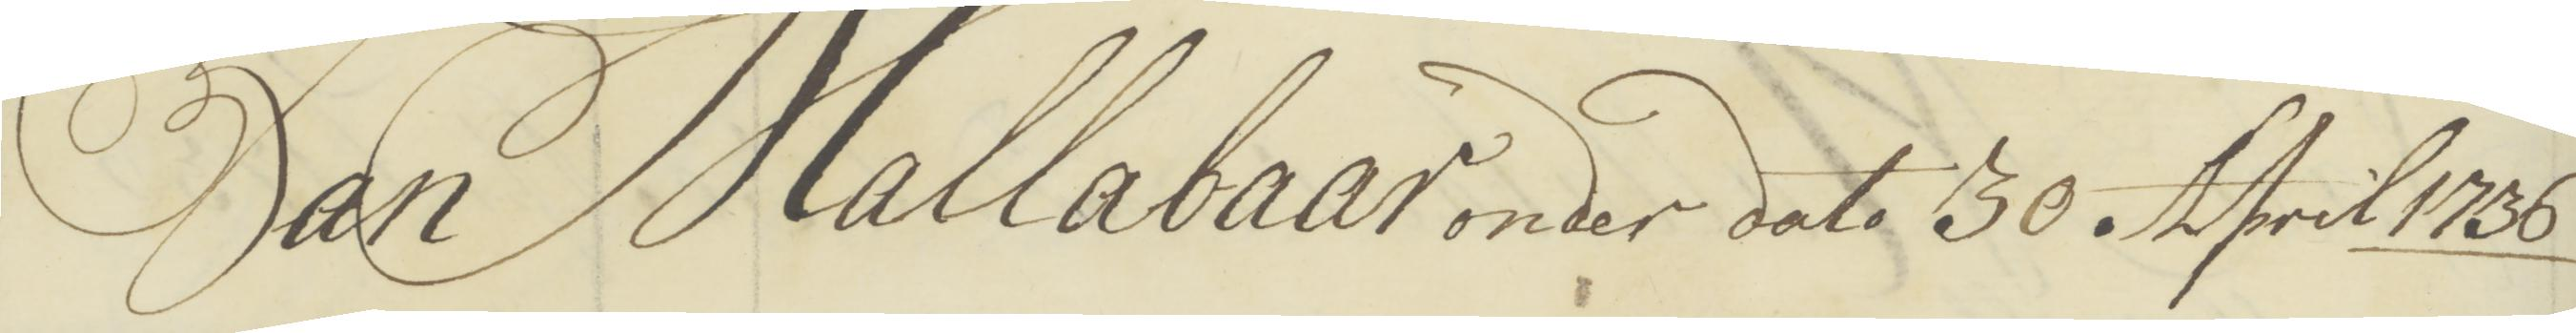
Van Mallabaar onder dato 30 April 1736.
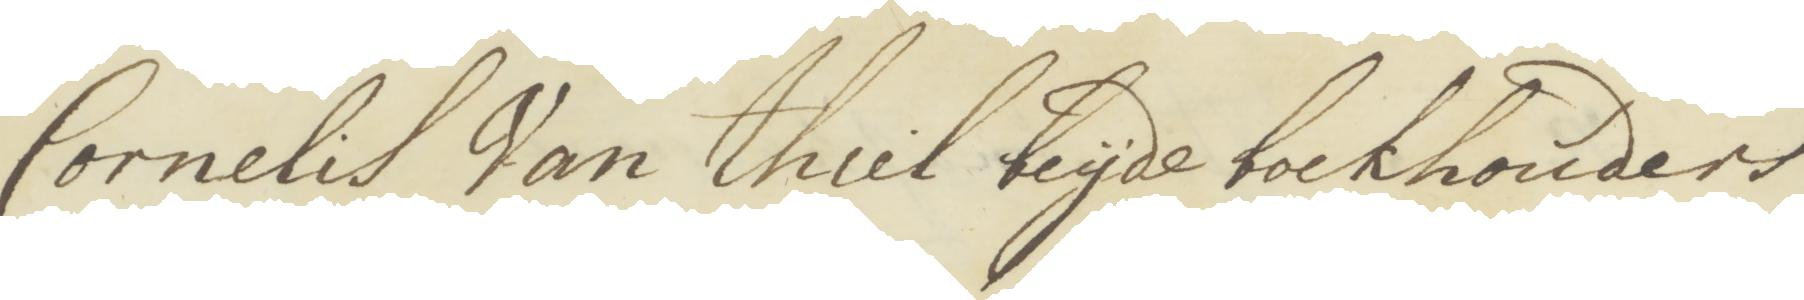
Cornelis van thiel beijde boekhouders
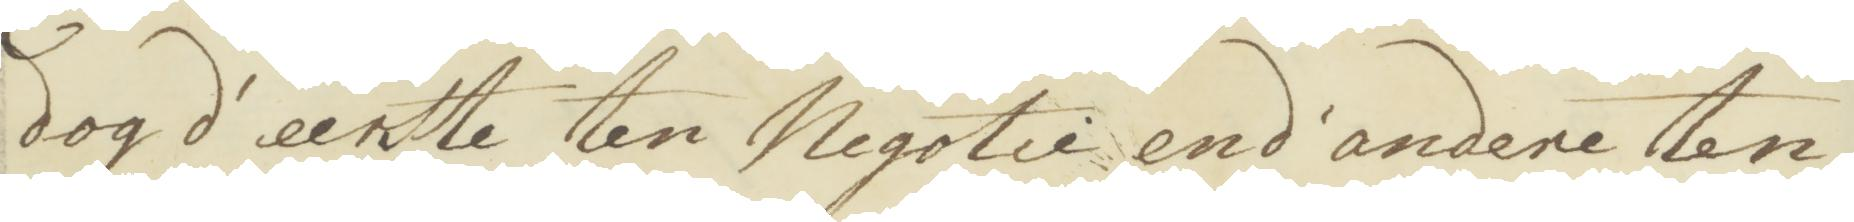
dog d’ eerste ten negotie end’ andere ten
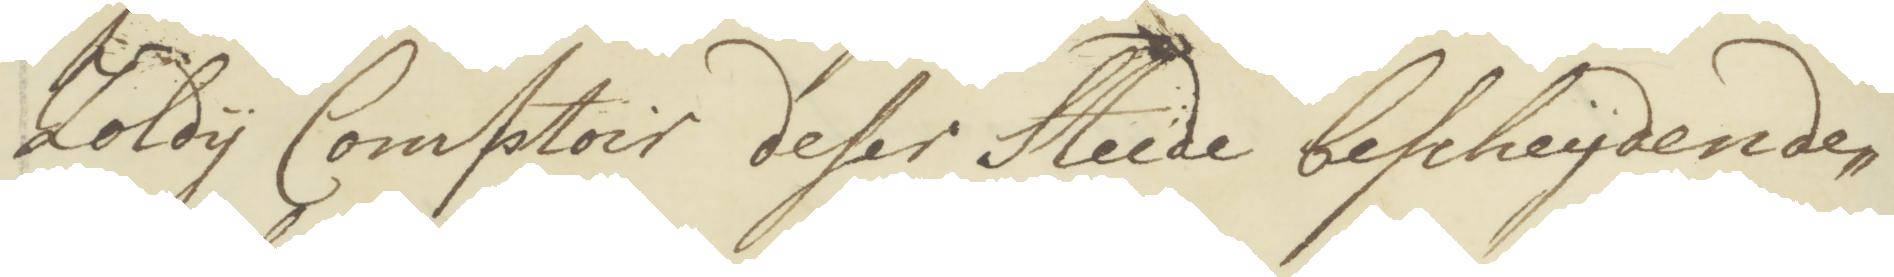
Zoldij Comptoir deser seede bescheijdende„
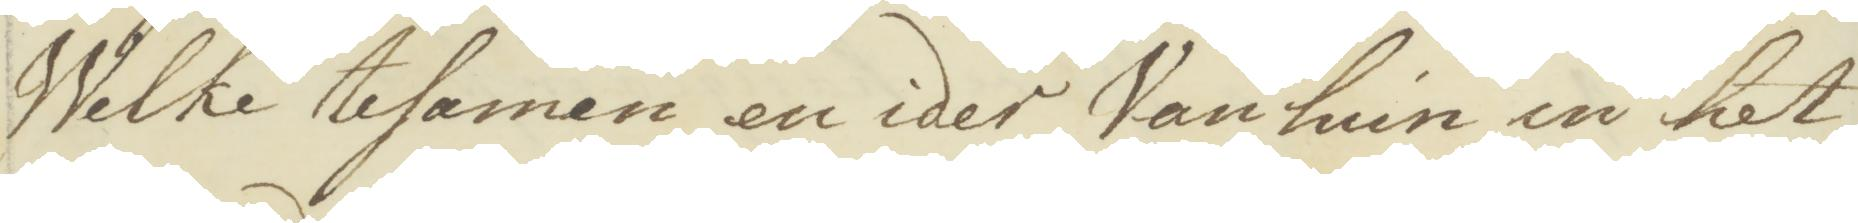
Welke tesamen en ider van hun in het
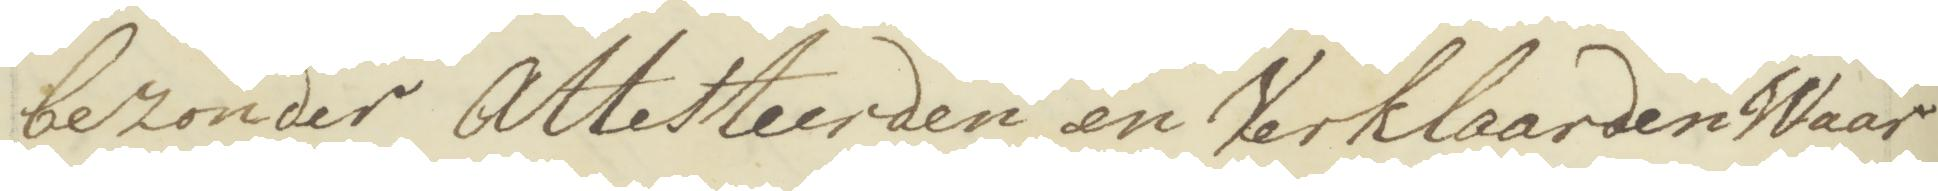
bezonder Attesteerden en verklaarden waar
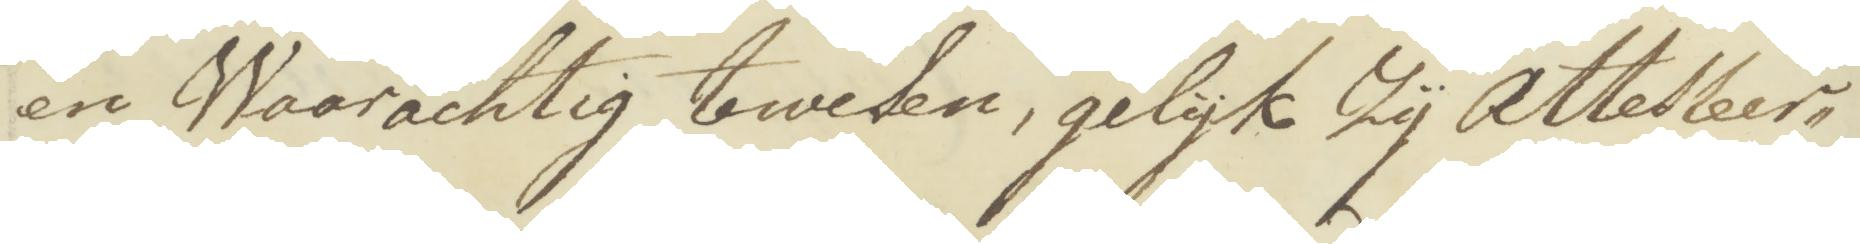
en waarachtig tewesen, gelijk zij attesteer„
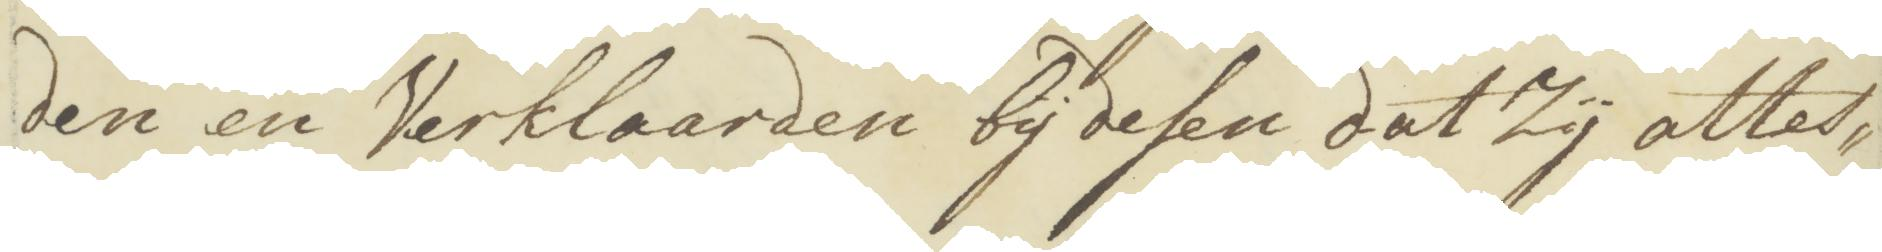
den en verklaarden bij desen dat zij attes„
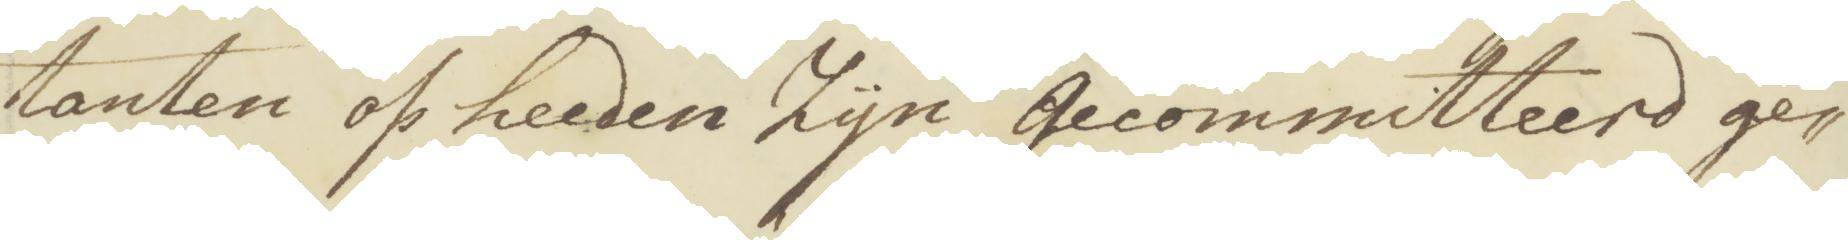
tanten op heeden zijn gecommitteerd ge„
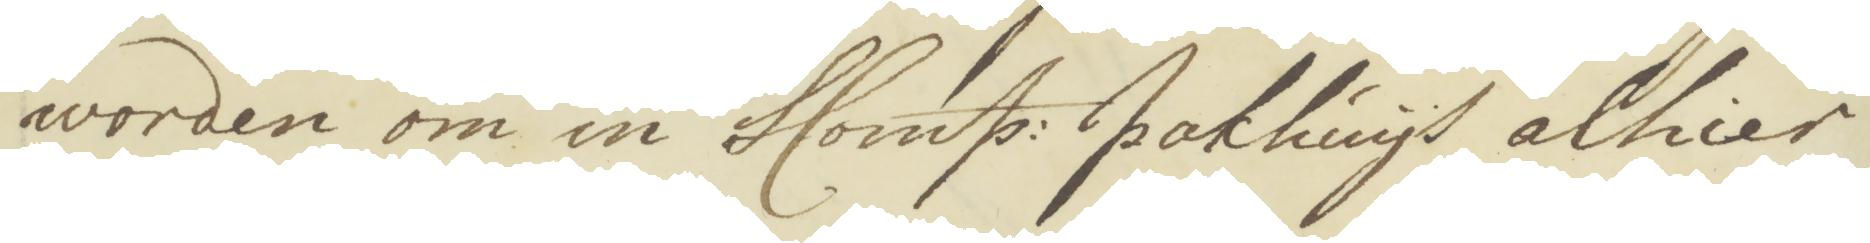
worden om in ’sComp: pakhuijs alhier
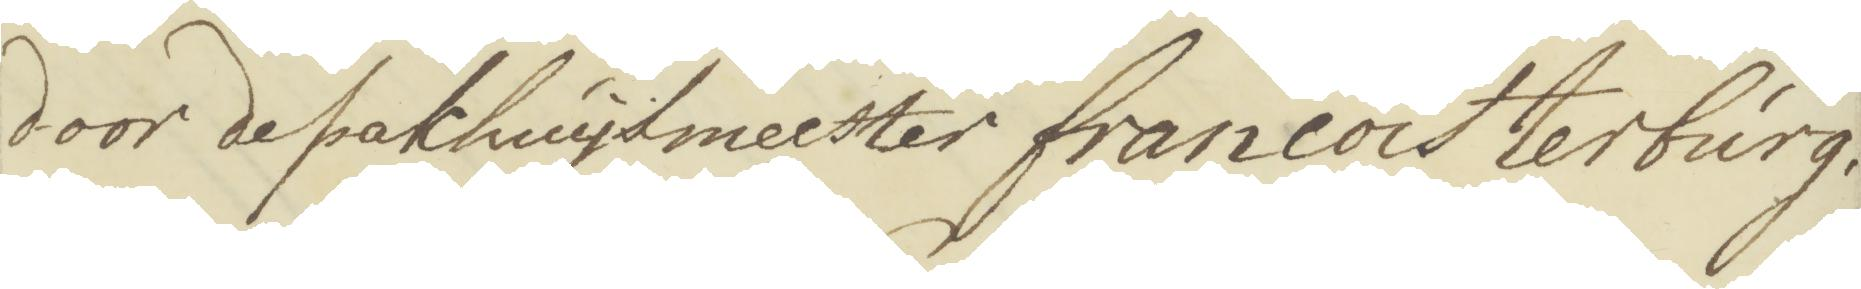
door de pakhuijsmeester francois terburg,
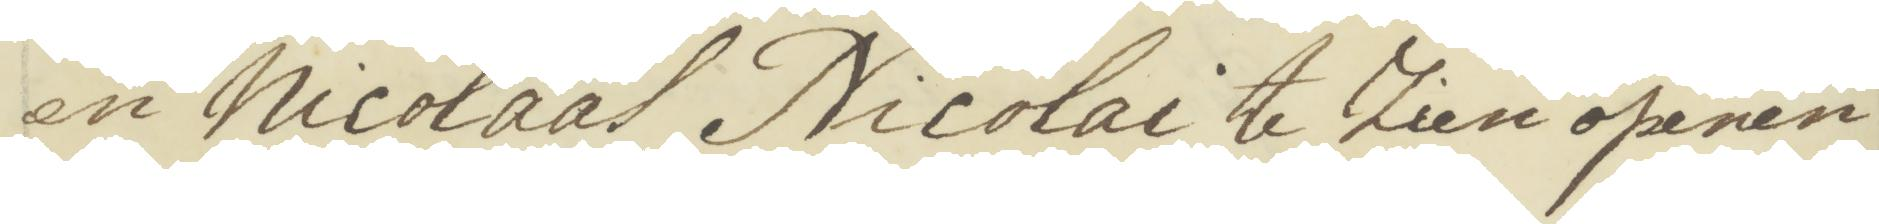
en Nicolaas Nicolai te zien openen
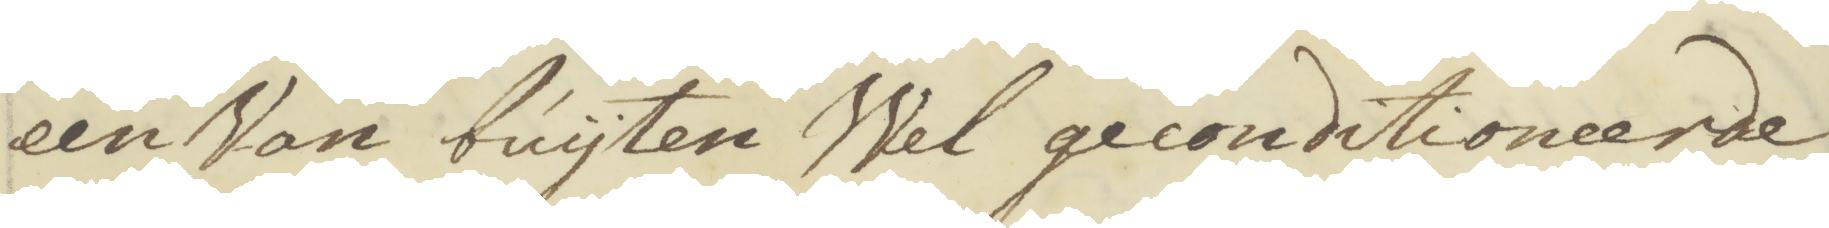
een van buijten wel geconditioneerde
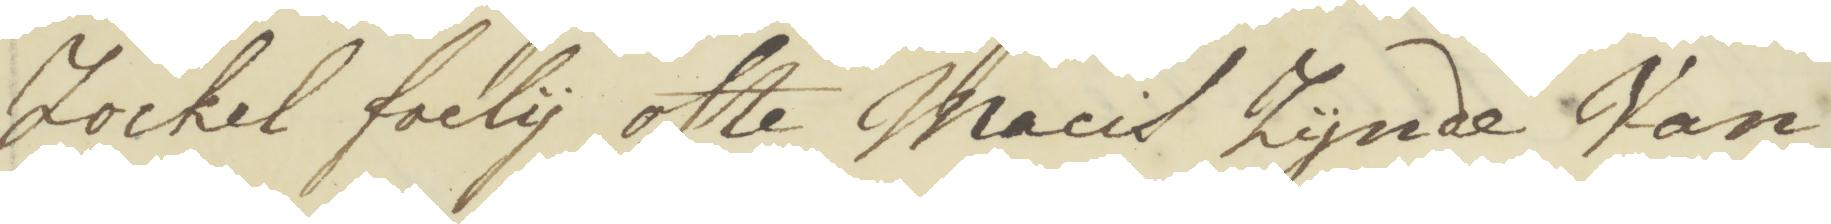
zockel foelij ofte Macis zijnde van
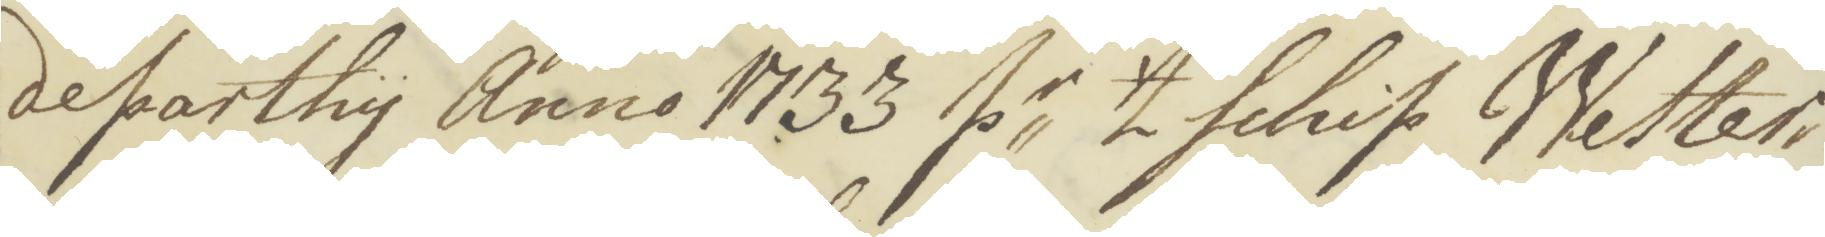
de parthij Anno 1733 p„r ’t schip Wetter
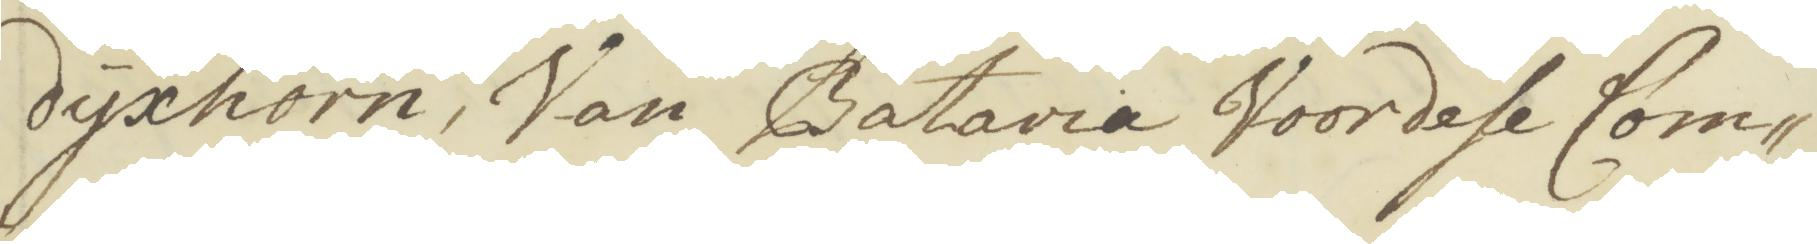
dijxhorn, van Batavia voor dese Com„
